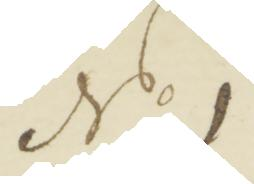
No 1
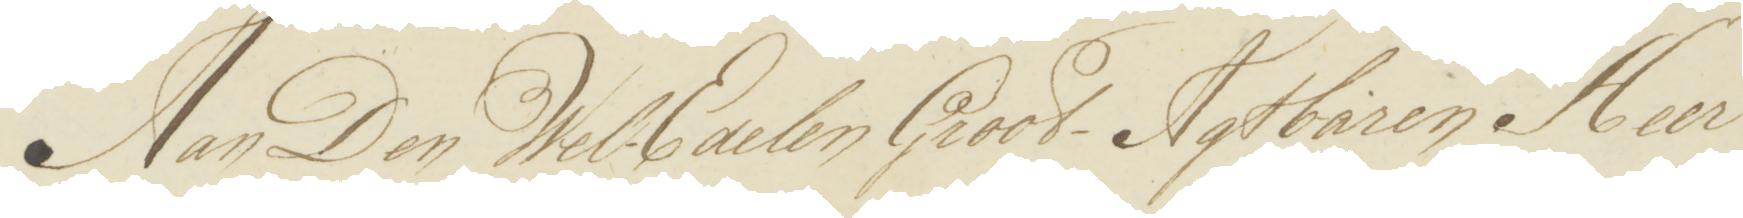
Aan Den Wel-Edelen Groot-Agtbaren Heer
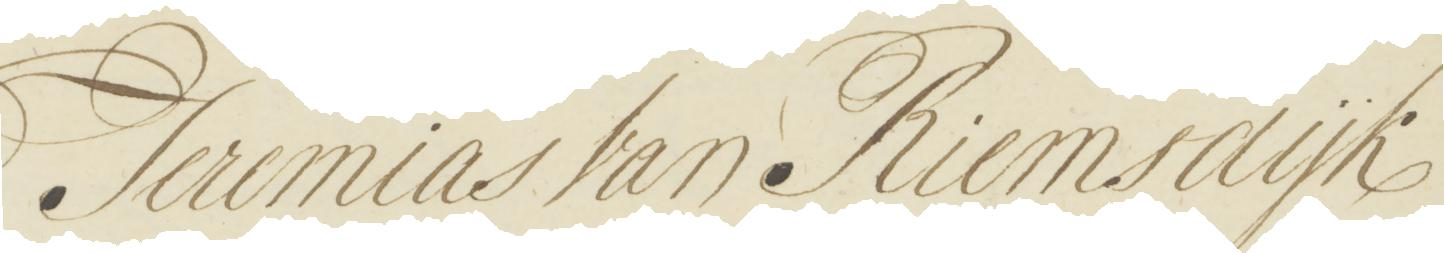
Jeremias Van Riemsdijk
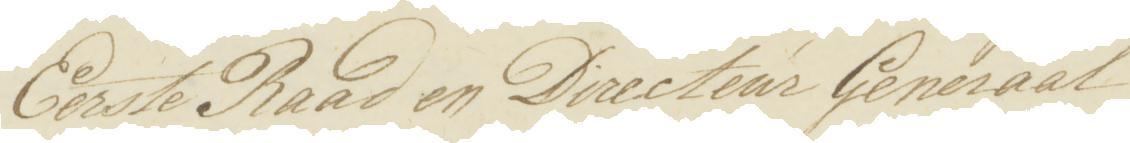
Eerste Raad en Directeur Generaal
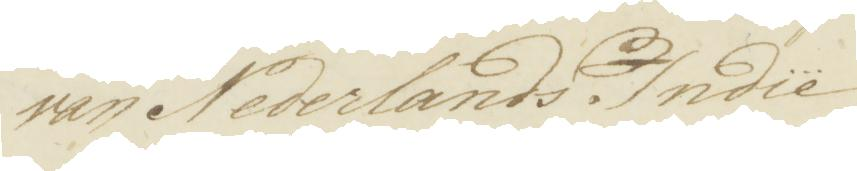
van Nederlands Indië,
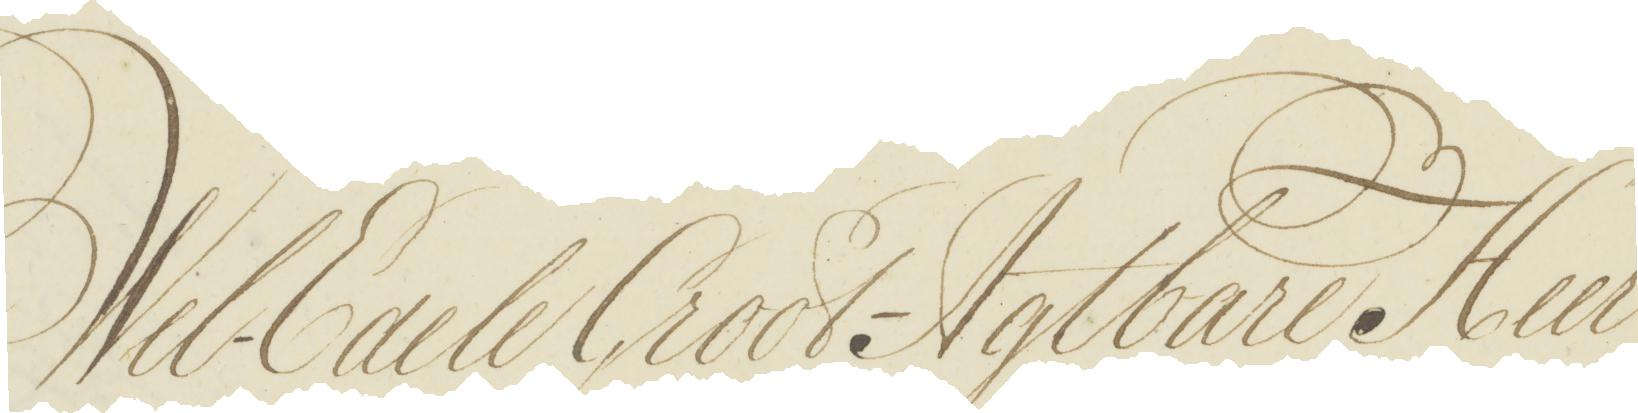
Wel-Edele Groot-Agtbare Heer
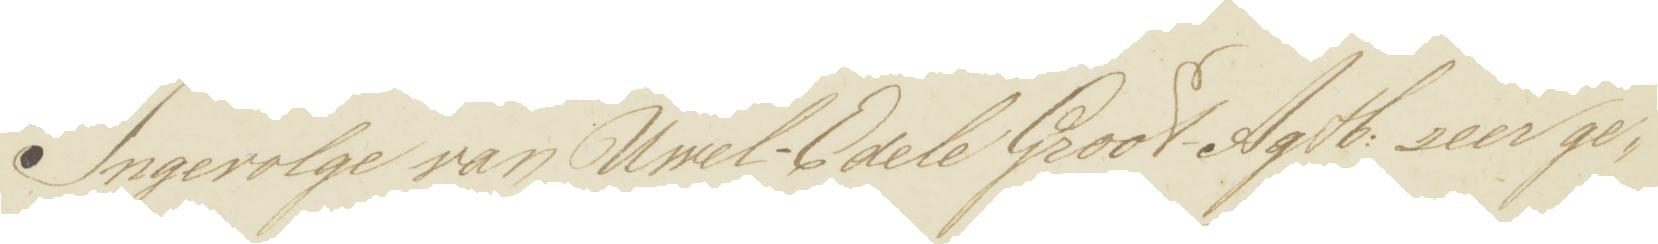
Ingevolge van Uwel-Edele Groot-Agtb: zeer ge„
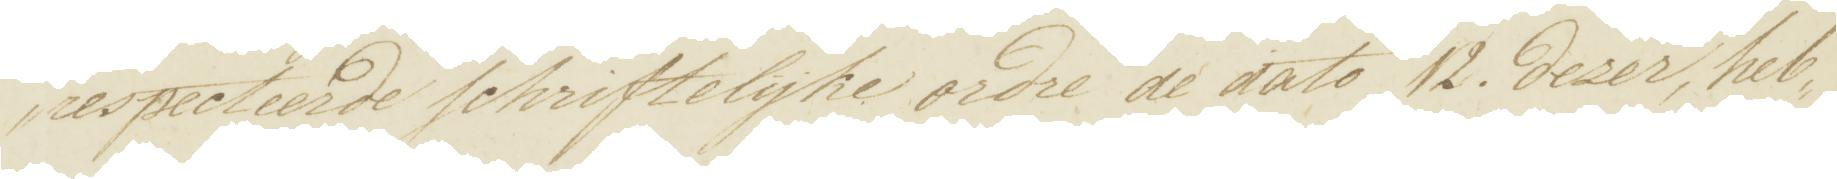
„respecteerde schriftelijke ordre de dato 12. dezer, heb„
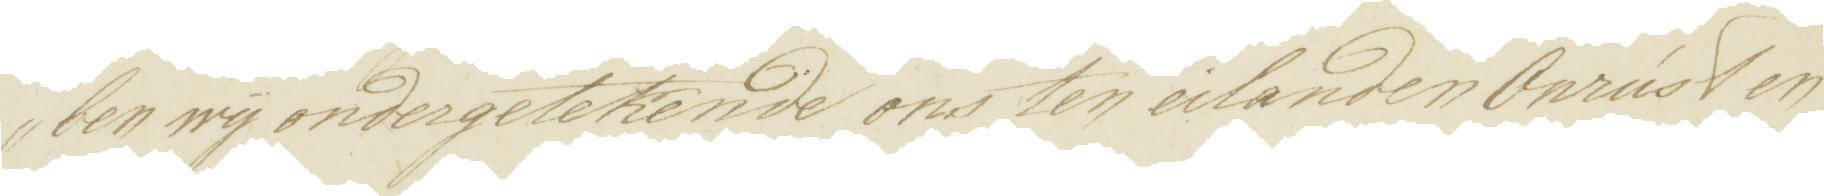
„ben wij ondergetekende ons ten eilanden Onrust en
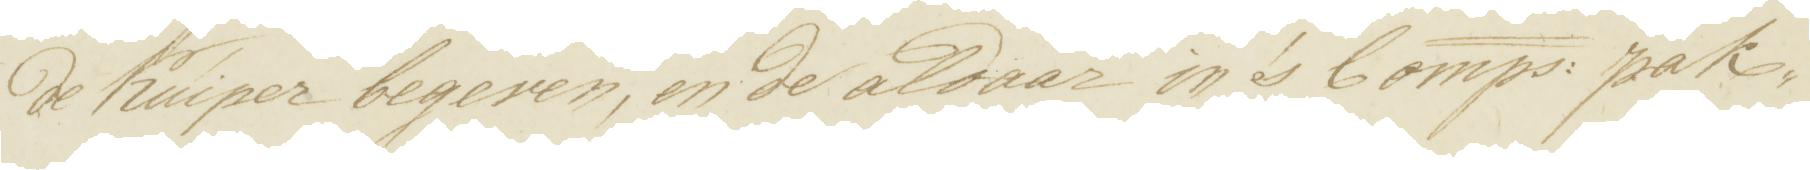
de Kuiper begeven, en de aldaar in ’s Comps: pak„
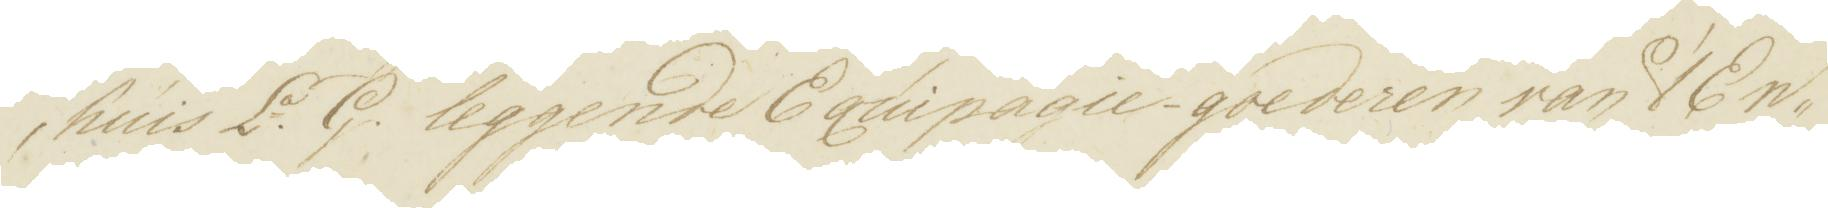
„huis L.a G. leggende Equipagie-goederen van ’t En„
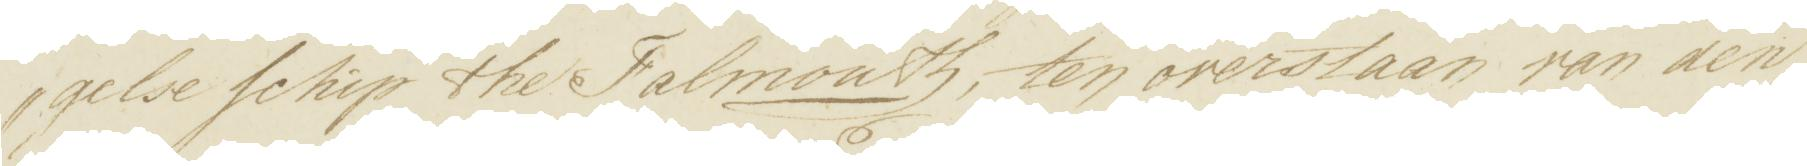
„gelse schip the Talmouth, ten overstaan van den
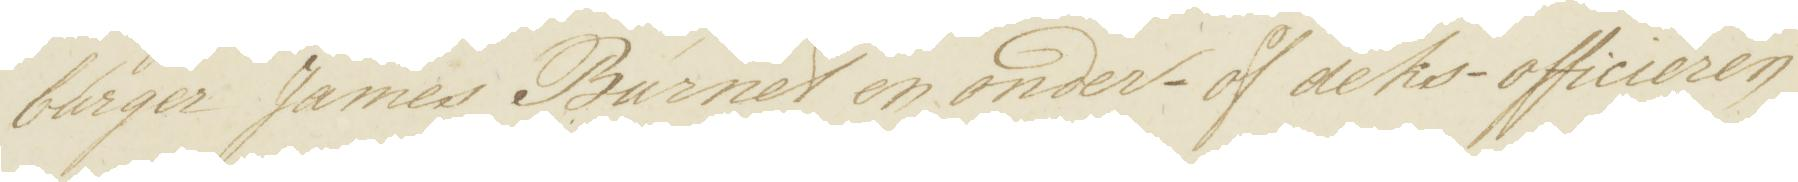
burger James Burnet en onder- of deks-officieren
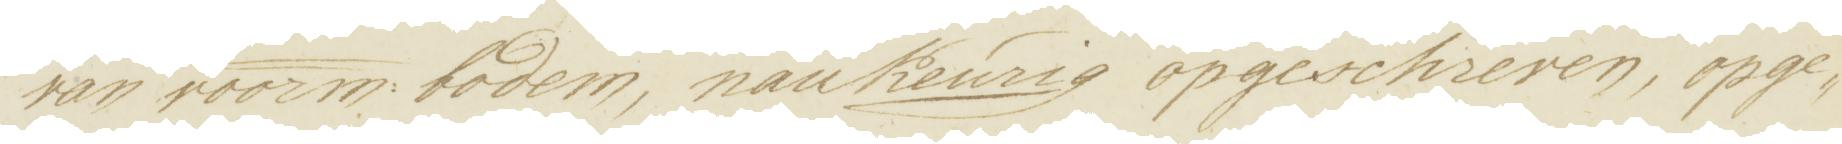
van voorm: bodem, naukeurig opgeschreven, opge„
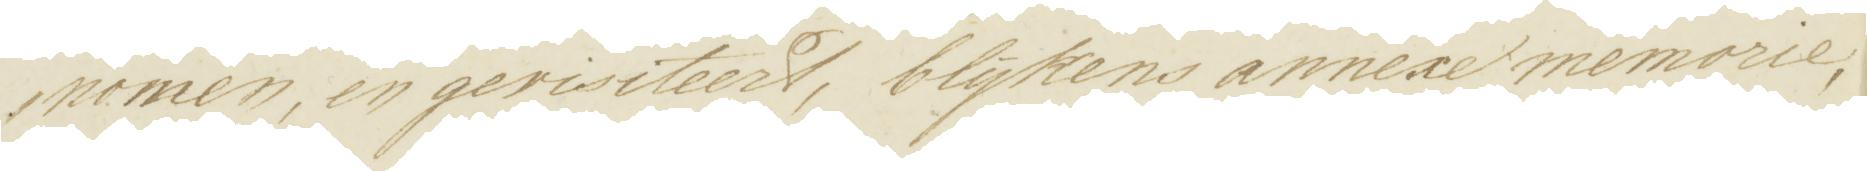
„nomen, en gevisiteert, blijkens annexe memorie,
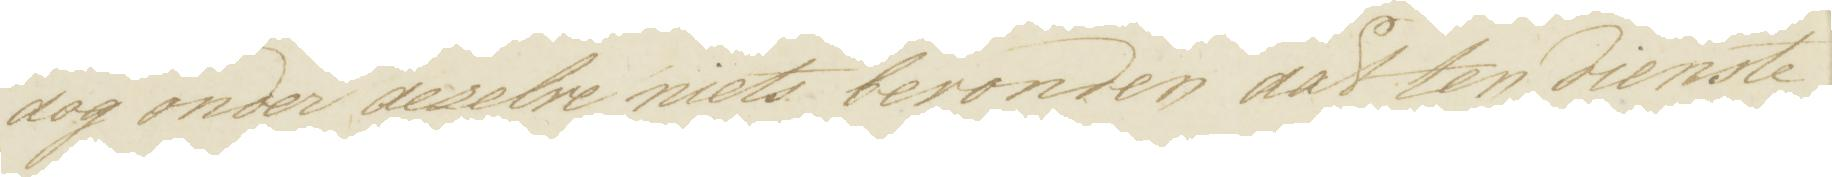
dog onder dezelve niets bevonden dat ten dienste
